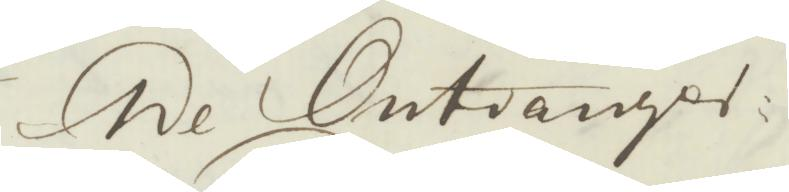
De Ontvanger:
